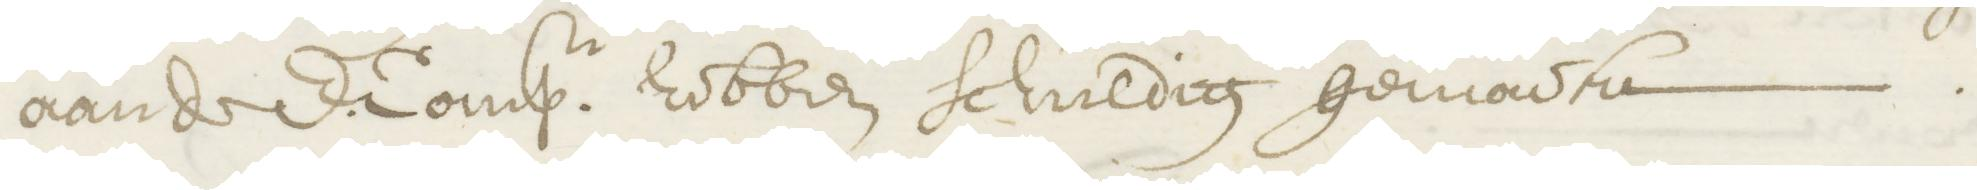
aan de E.Comp. hebben schuldig gemaekt.
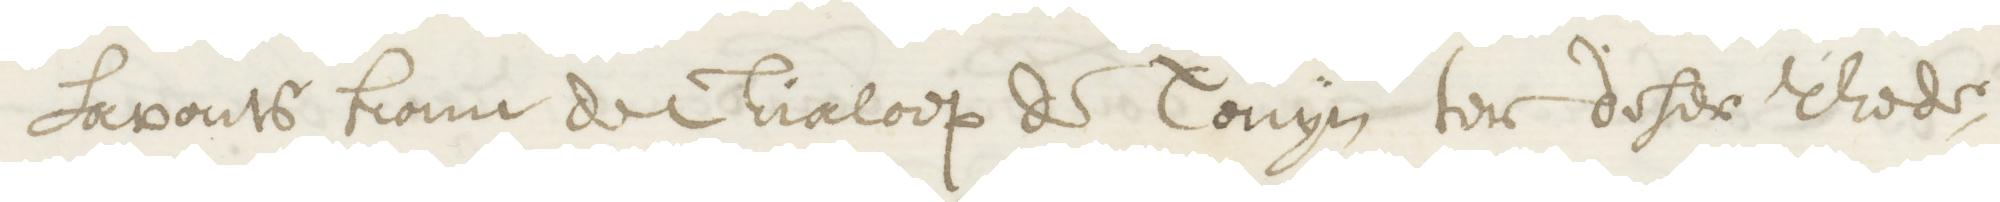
savonts komt de Chialoep de Tonijn ter deser rhede,
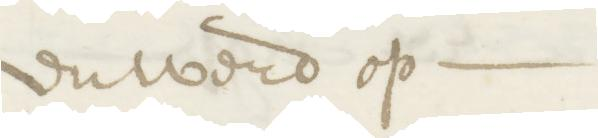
en werd op —
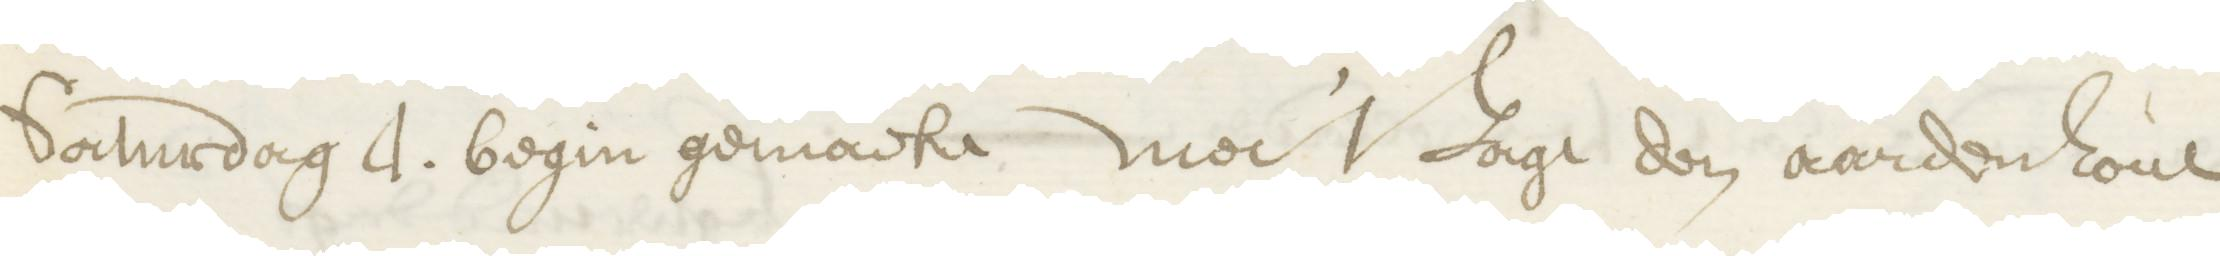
Saturdag 4. begin gemaekt met 't Iagt den aardenhout
